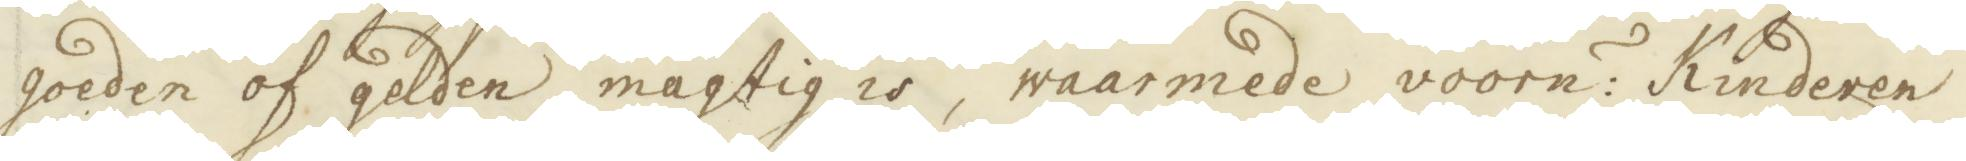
goeden of gelden magtig is, waarmede voorn: kinderen
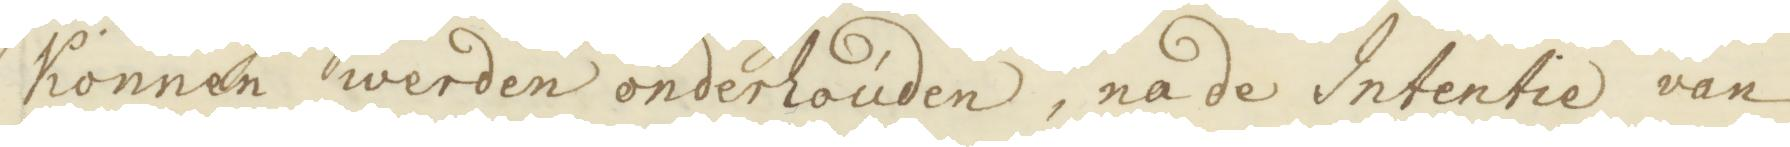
konnen werden onderhouden, na de jntentie van
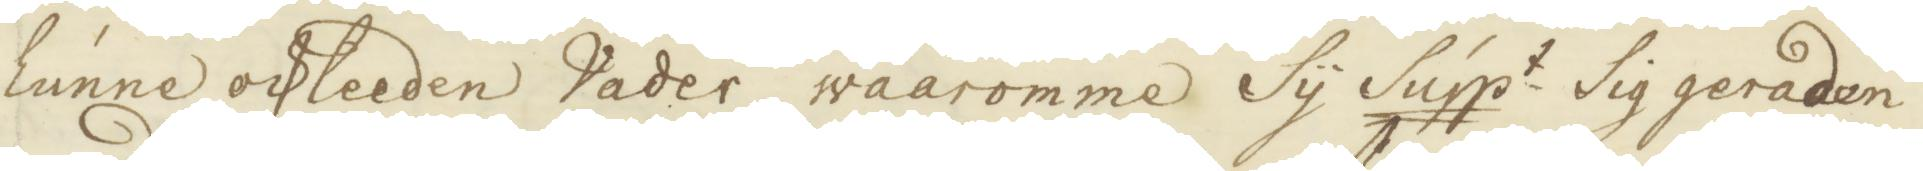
hunne overleeden vader, waaromme sij supp=t sig geraden
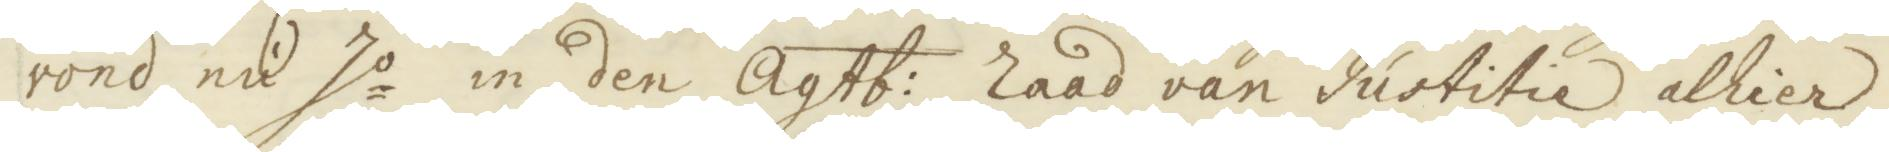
vond nu J=o in den Agtb: raad van Justitie alhier
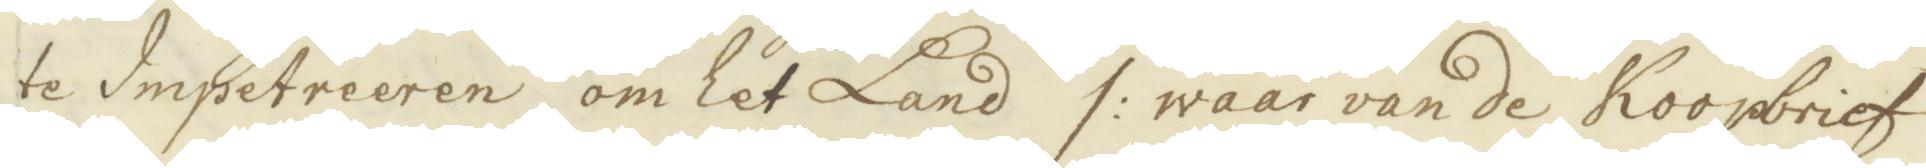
te jmpetreeren om het land /: waar van de koopbrief
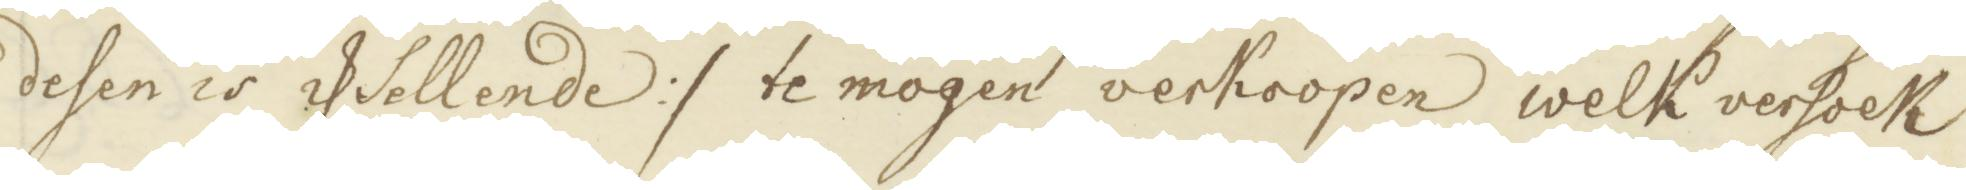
desen is versellende :/ te mogen verkoopen welk versoek
